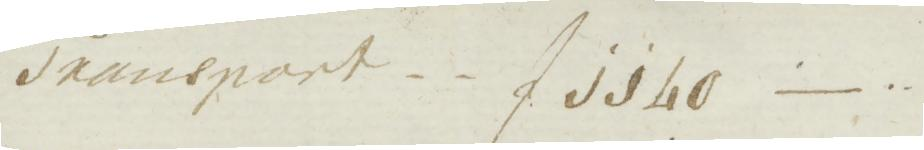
Transport - ƒ 1140 — „
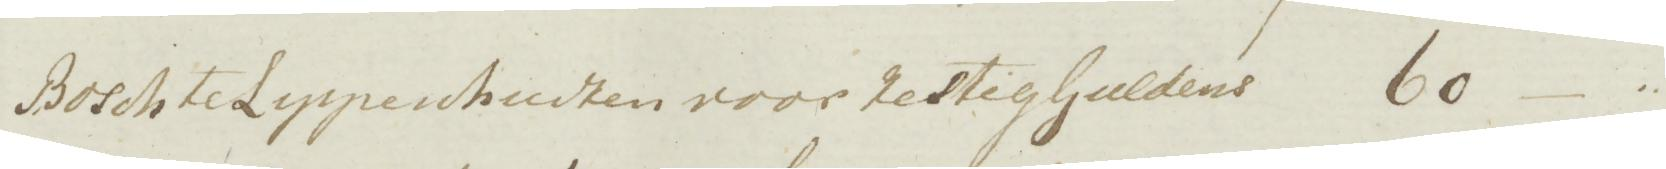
Bosch te Lippenhuizen voor zestig Guldens 60 — „
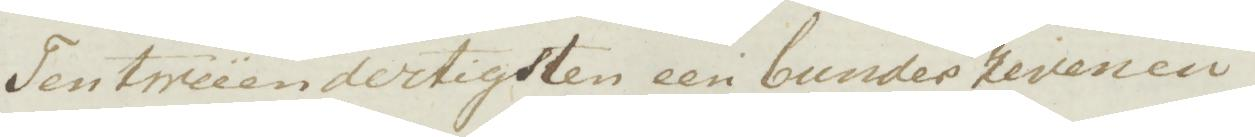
Ten tweeën dertigsten een bunder zevenen
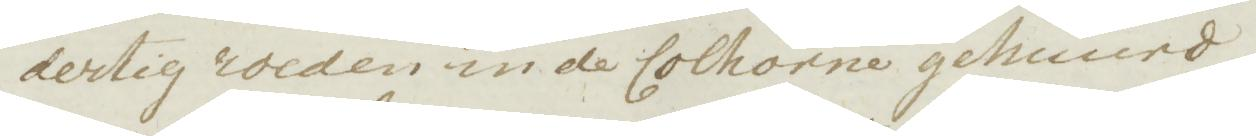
dertig roeden in de Colhorne gehuurd
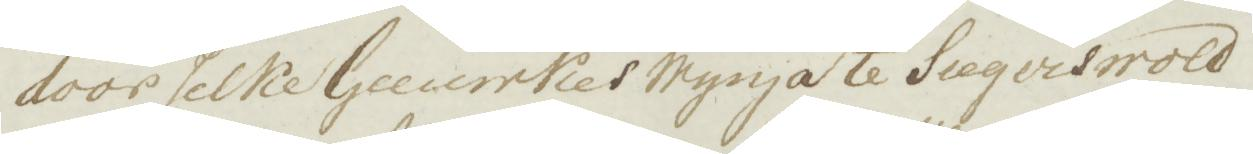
door Jelke Geeuwkes Wynja te Siegerswold
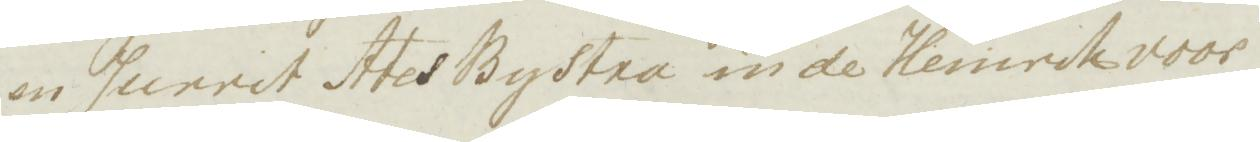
en Jurrit Ates Bystra in de Hemrik voor
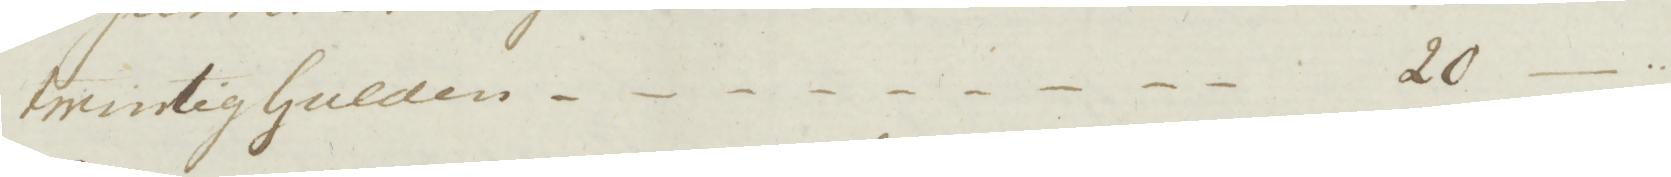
twintig Gulden - - - - - - - - - 20 — „
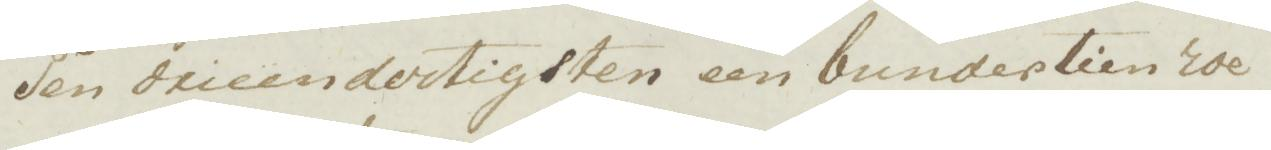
Ten drieën dertigsten een bunder tien roe
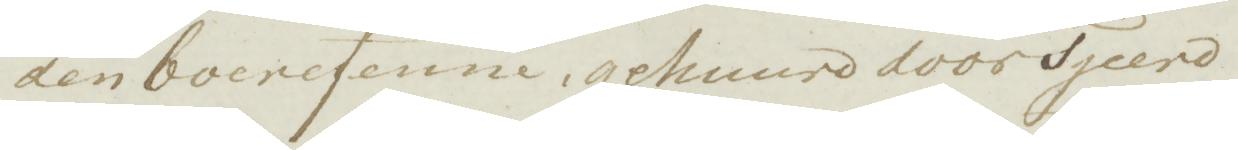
den boerefenne, gehuurd door Tjeerd
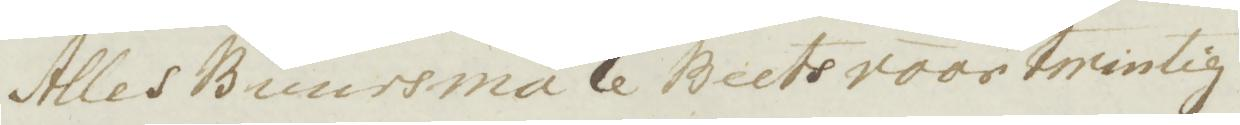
Alles Buursma te Beets voor twintig
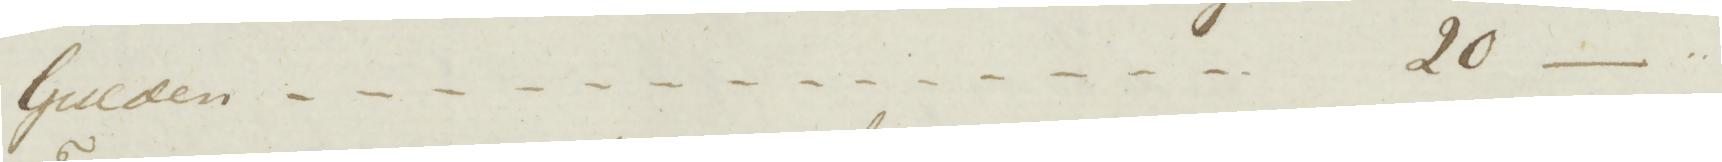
Gulden - - - - - - - - - - - - - - 20 — „
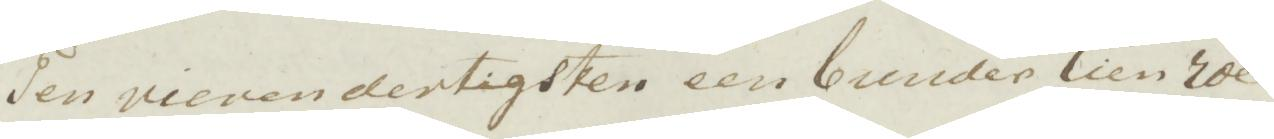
Ten vieren dertigsten een bunder tien roe
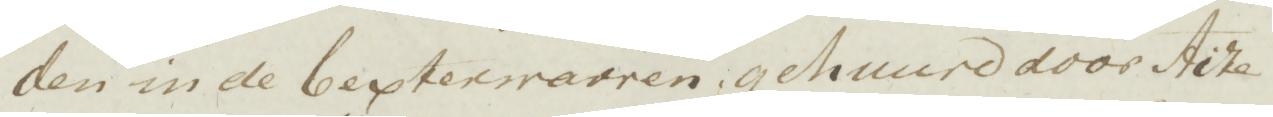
den in de bexterwarren, gehuurd door Aize
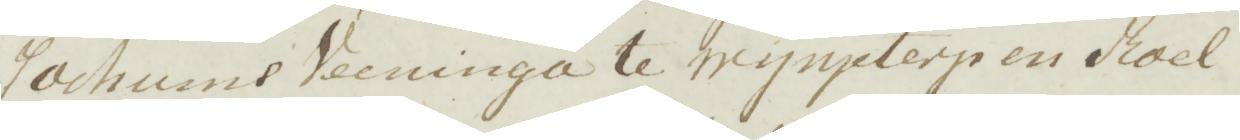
Jochums Veeninga te wijnjeterp en Roel
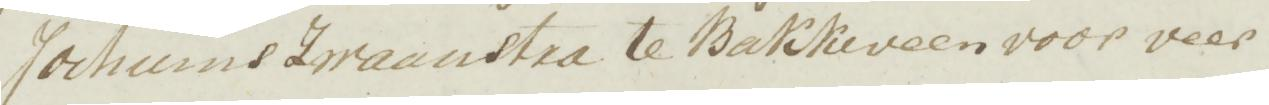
Jochums Zwaanstra te Bakkeveen voor veer
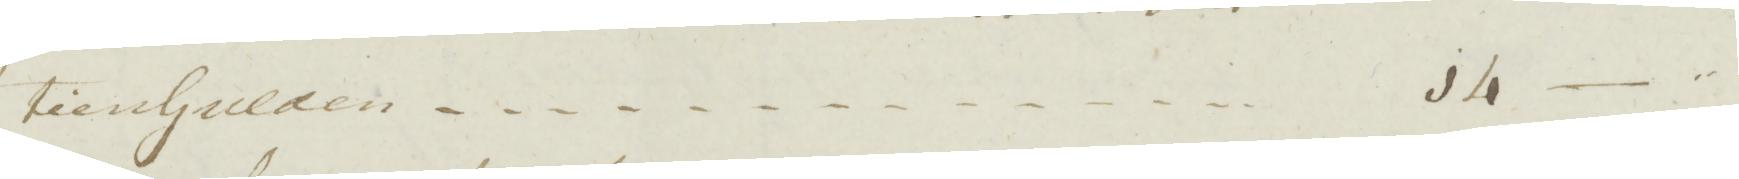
tien Gulden - - - - - - - - - - - - - 14 — „
